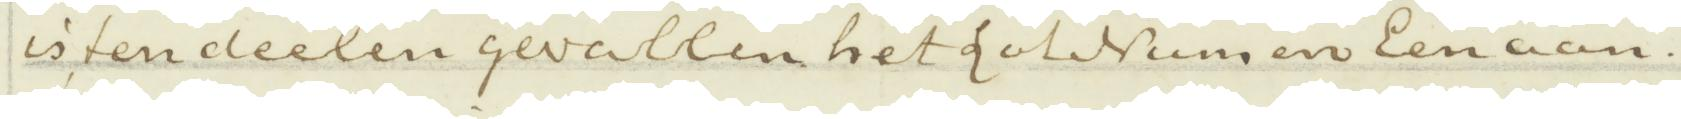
is ten deelen gevallen het Lot Numero Een aan
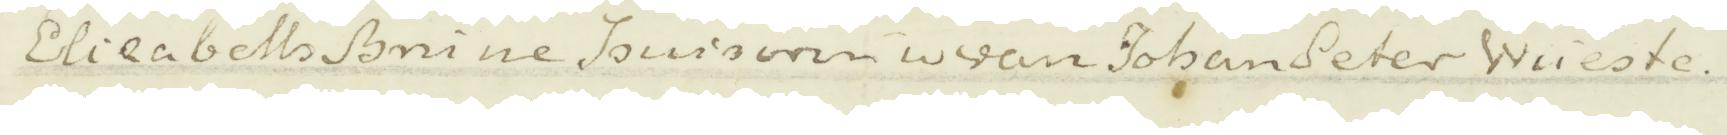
Elizabeth Brune huisvrouw van Johan Peter Wueste.
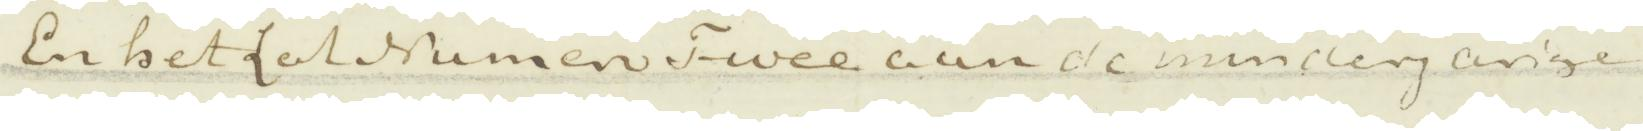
En het Lot Numero Twee aan de minderjarige
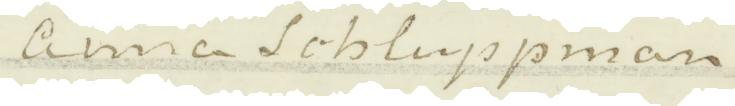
Anna Schluppman
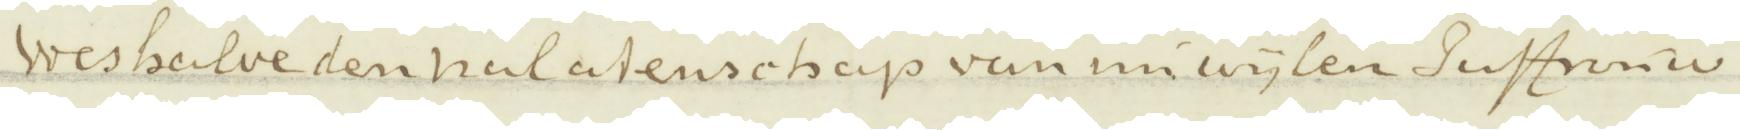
Weshalve den nalatenschap van nu wijlen Iuffrouw
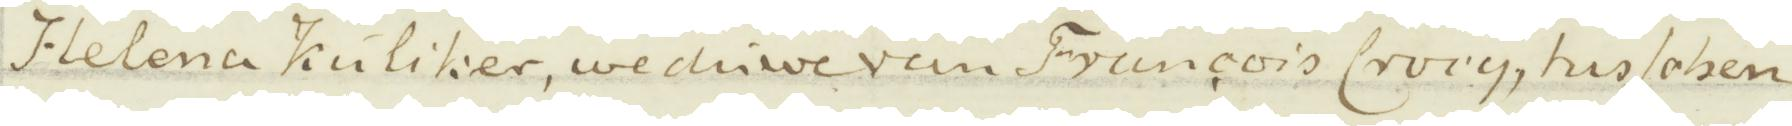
Helena Kuliker, weduwe van François Crooq, tusschen
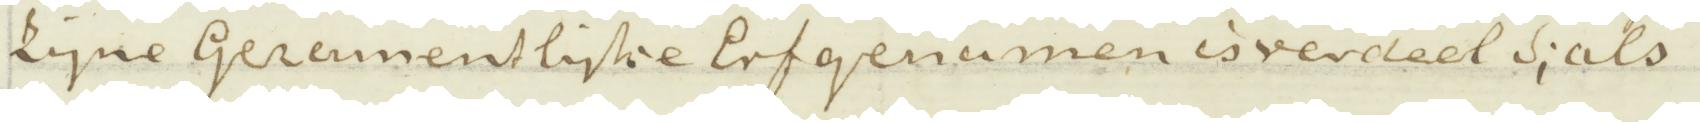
Zijne Gezamentlijke Erfgenamen is verdeeld; als
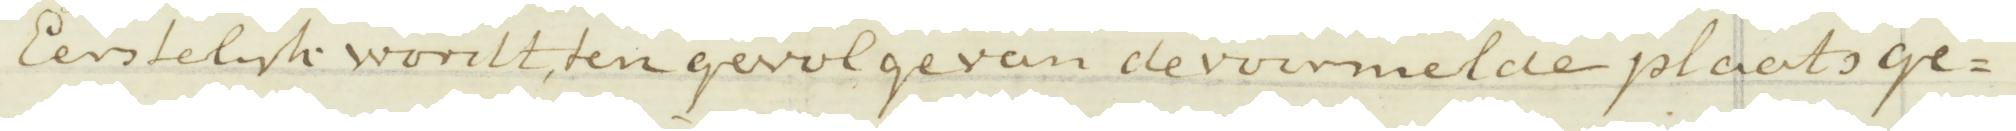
Eerstelyk wordt, ten gevolge van de voormelde plaats ge=
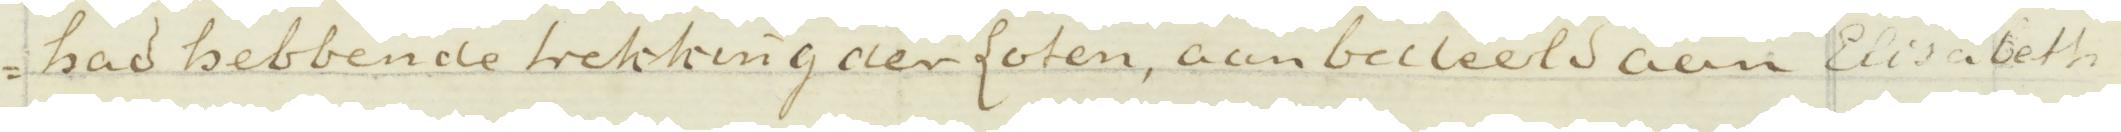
=had hebbende trekking der Loten, aanbedeeld aan Elisabeth
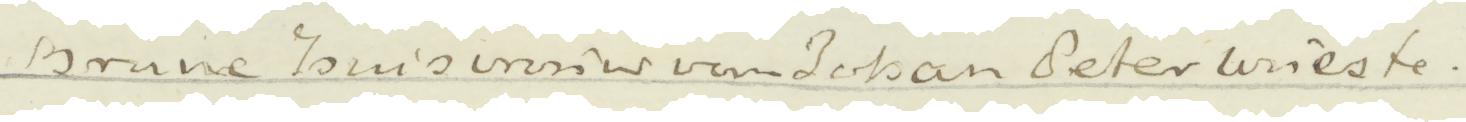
Brune huisvrouw van Johan Peter wueste
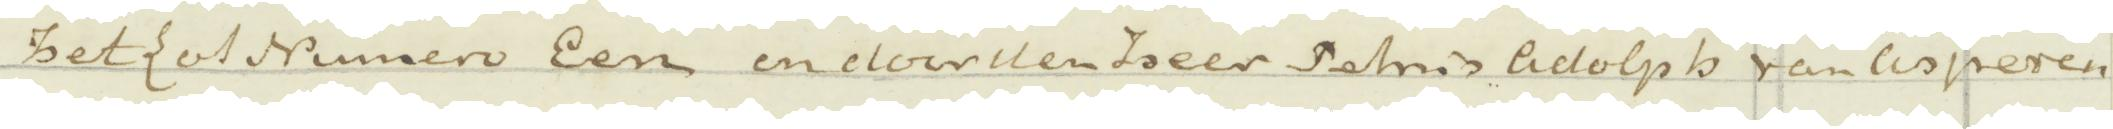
het Lot Numero Een en door den Heer Petrus Adolph van Asperen
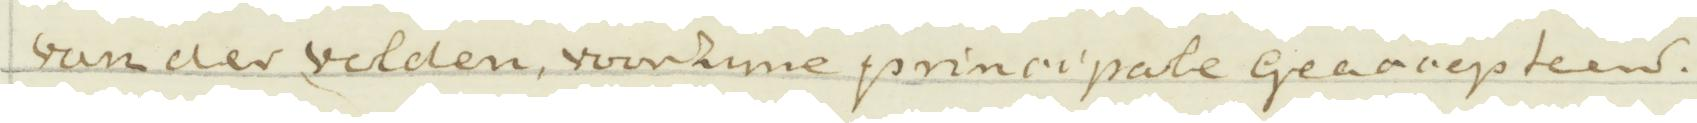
van der velden, voor Zyne principale geaccepteerd.
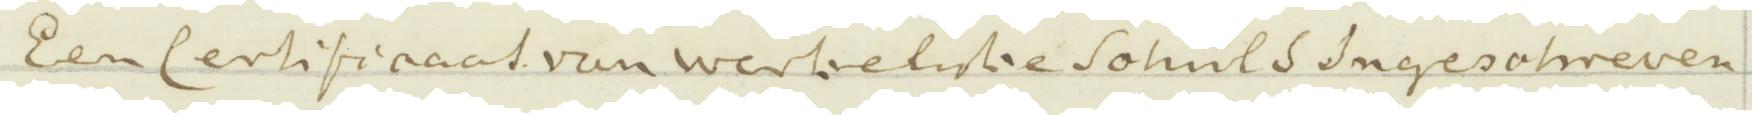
Een Certificaat van werkelyke schuld Ingeschreven
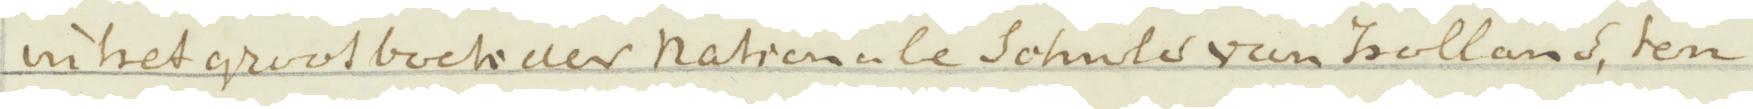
in het grootboek der Nationale Schuld van Holland, ten
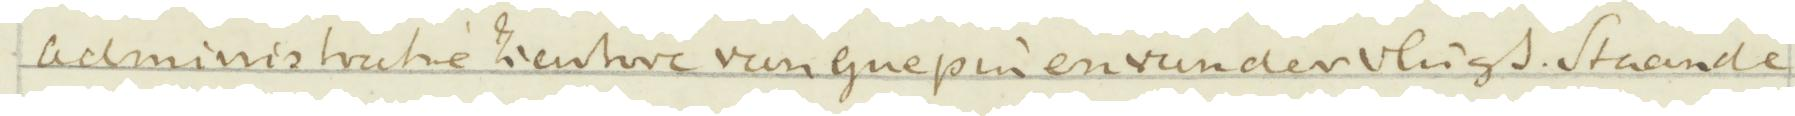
administratie kantore van guepin en van der vlugt Staande
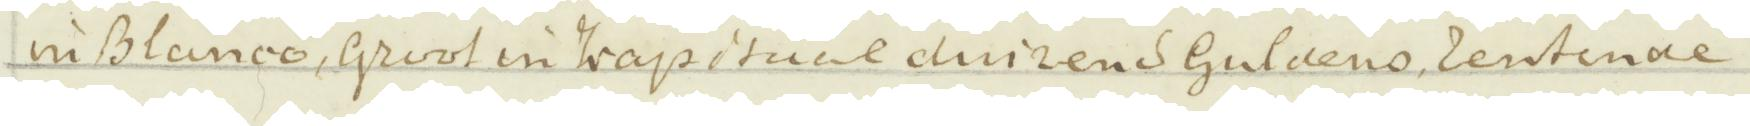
in Blanco, groot in kapitaal duizend guldens rentende
